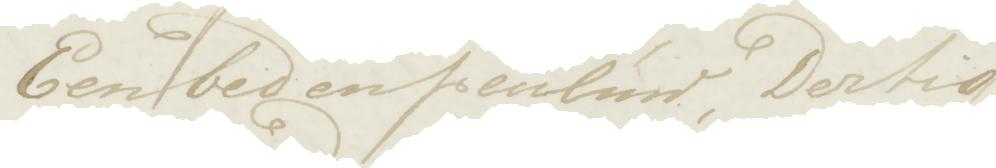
Een bed en peuluw, Dertig
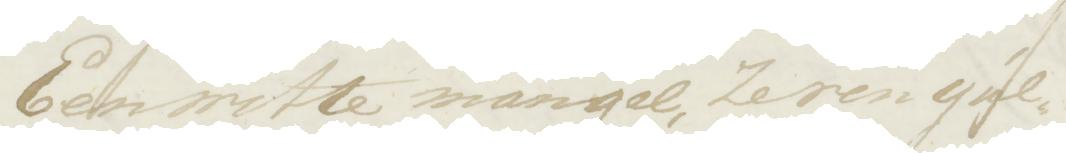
Een witte mangel, zeven gul„
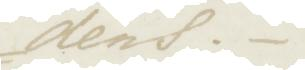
„dens. –
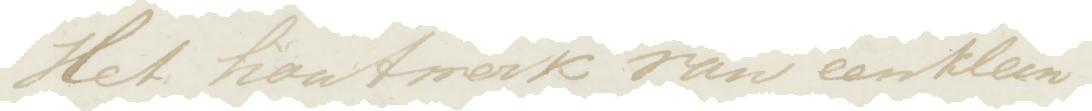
Het houtwerk van een klein
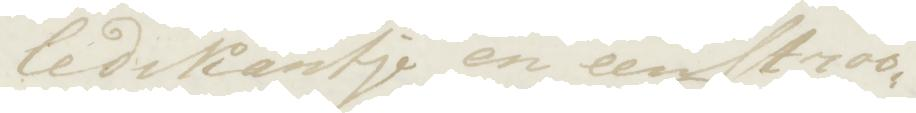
ledikantje en een stroo„
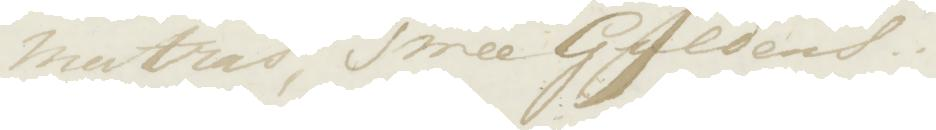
matras, Twee Guldens.
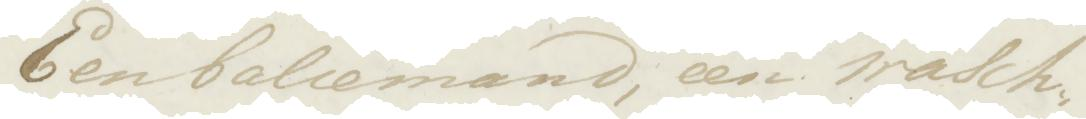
Een baliemand, een wasch„
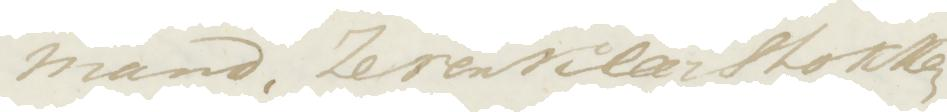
mand, zeven Kleer stokken
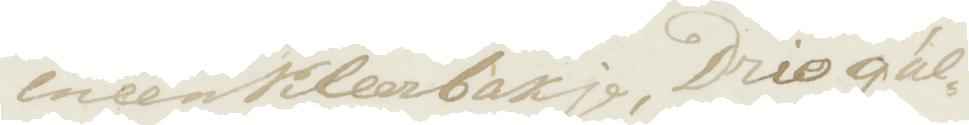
en een Kleerbakje, Drie gul„
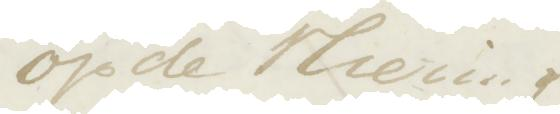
op de Vliering
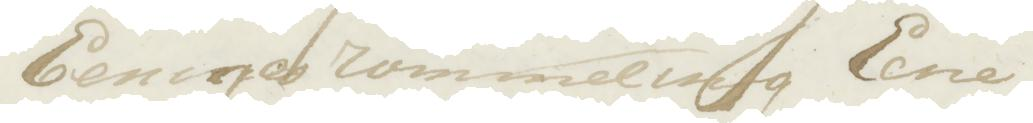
Eenige rommeling Eene
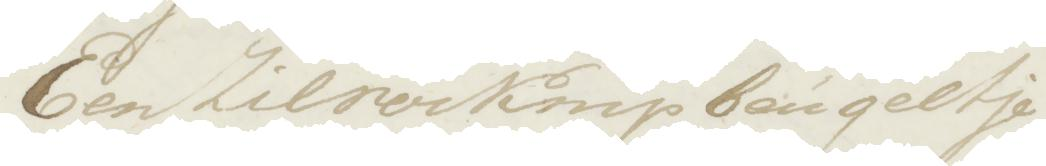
Een Zilverknip beugeltje
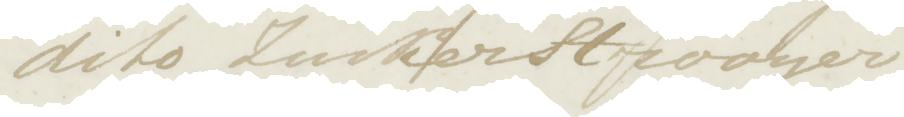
dito Zuikerstrooyer,
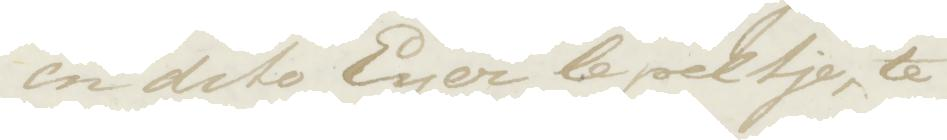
en dito Eyer lepeltje, te
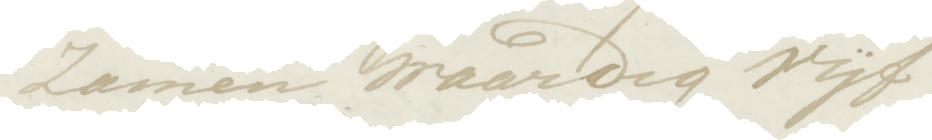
Zamen waardig vijf
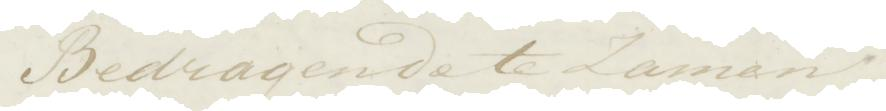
Bedragende te Zamen,
